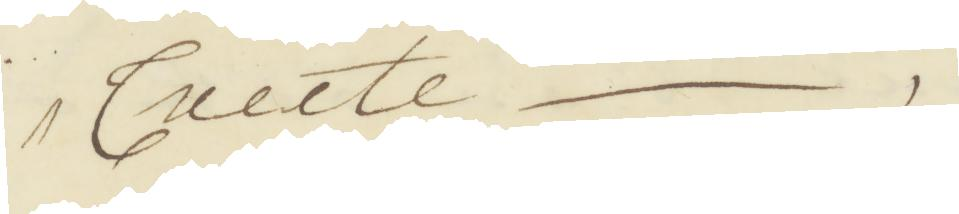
„creete—,
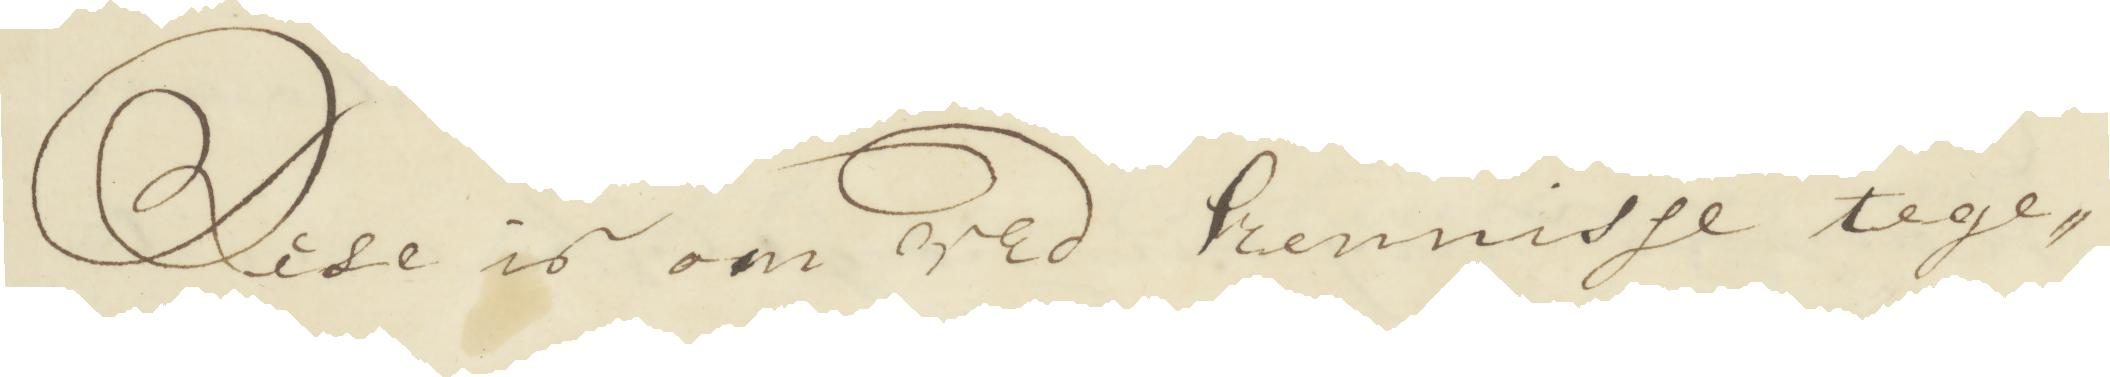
Dese is om VEd kennisse tege„
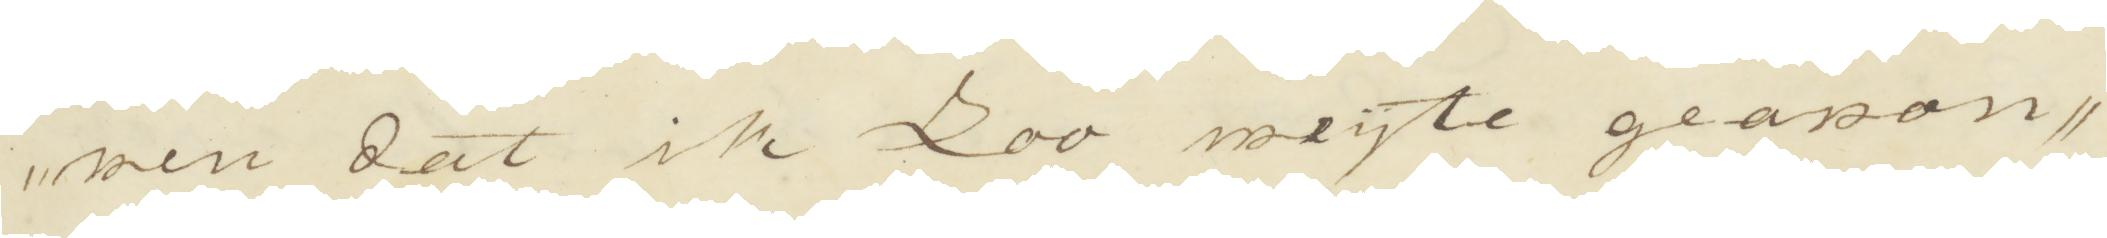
„ven dat ik zoo weijte geavon„
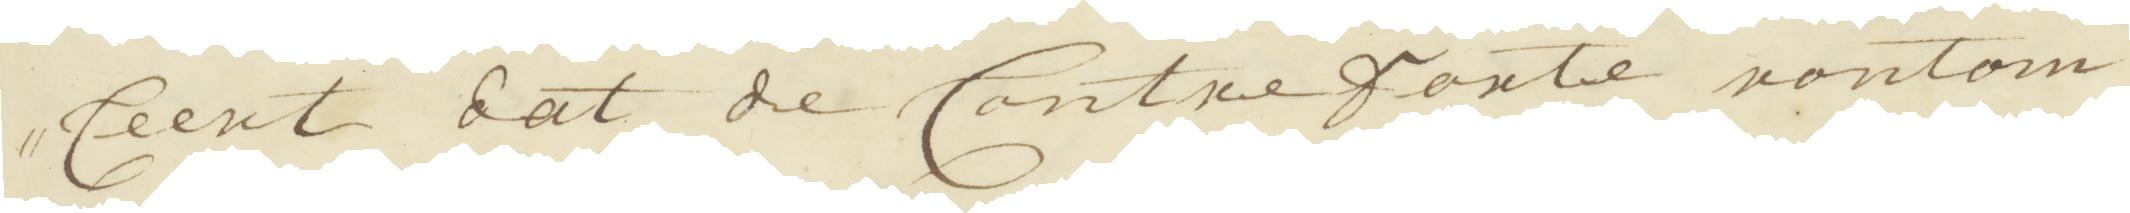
„ceert dat de Contreforte rontom
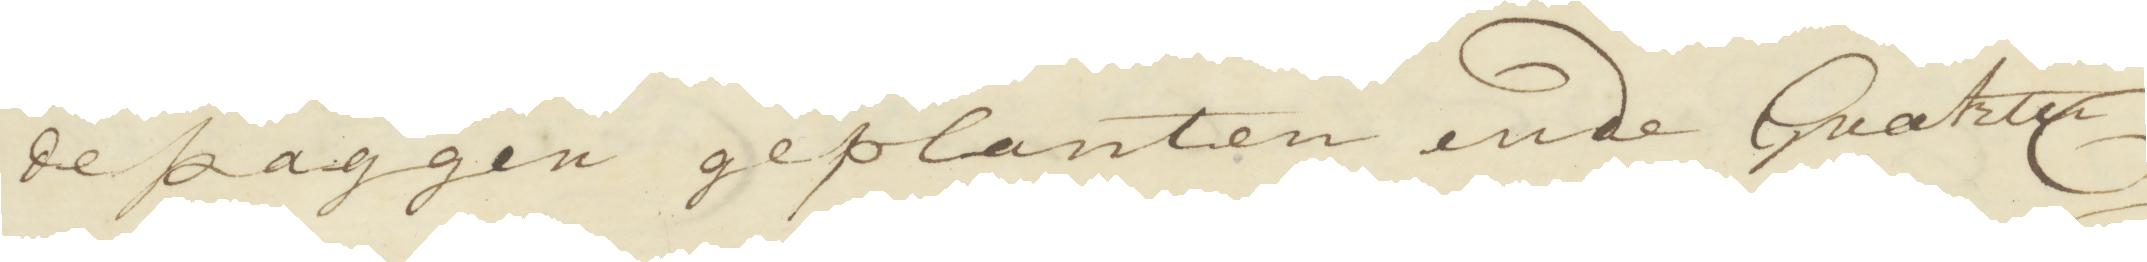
de paggen geplanten ende Grakten
